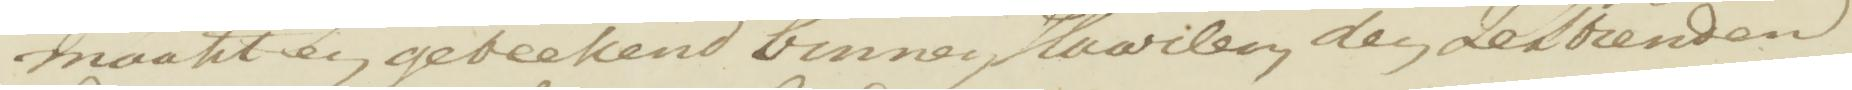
maakt en geteekend binnen Haarlem den zestienden
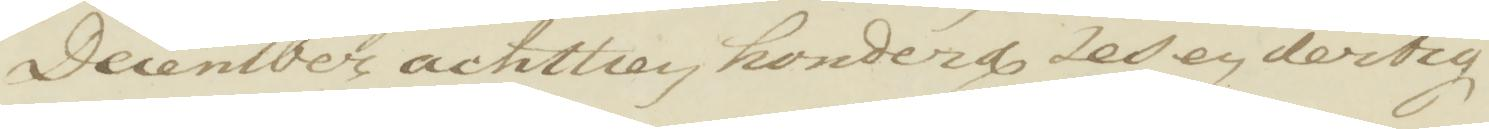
December achttien honderd zes en dertig
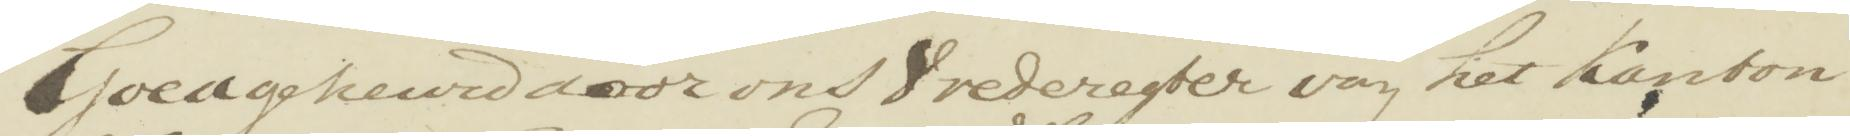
Goedgekeurd door ons Vrederegter van het kanton
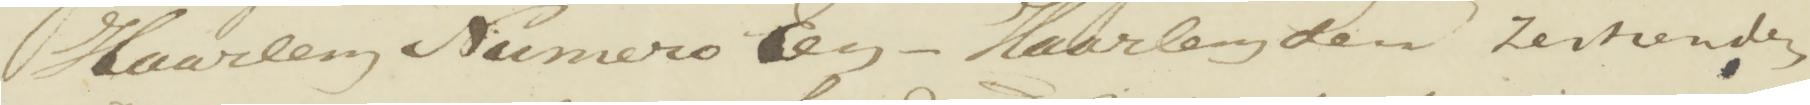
Haarlem Numero Een - Haarlem den Zestienden
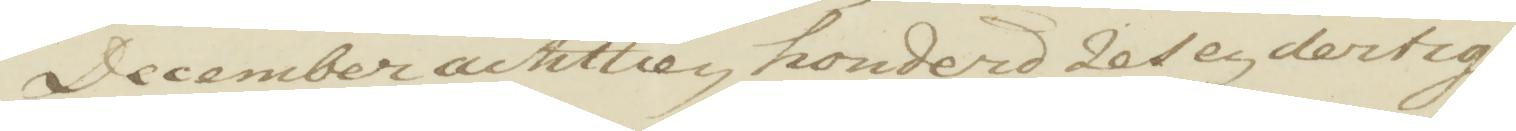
December achttien honderd zes en dertig.
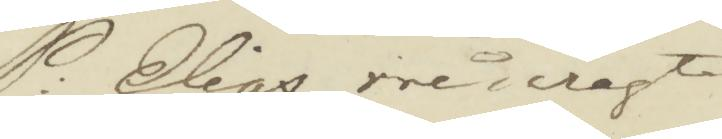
P. Elias vrederegter
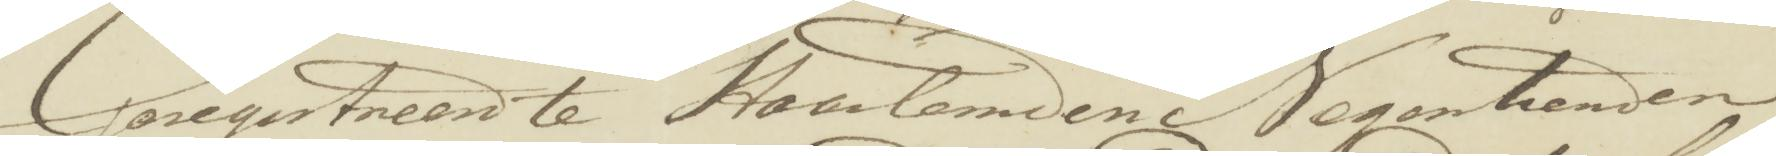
Geregistreerd te Haarlem den Negentienden
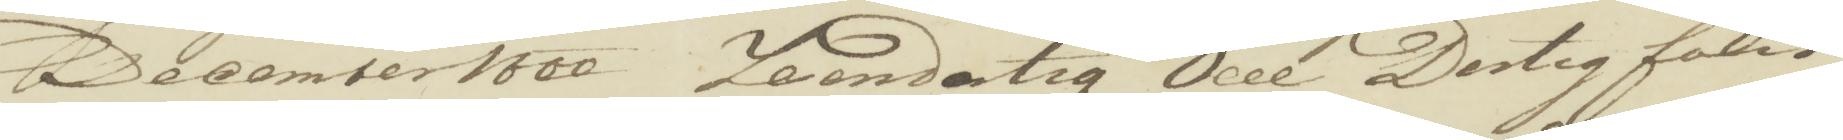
December 1800 Zesendertig deel Dertig folio
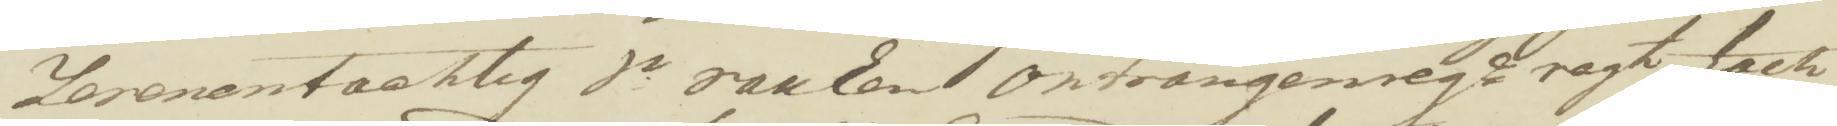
Zevenentachtig V:o van Een ontvangen regt regt tact
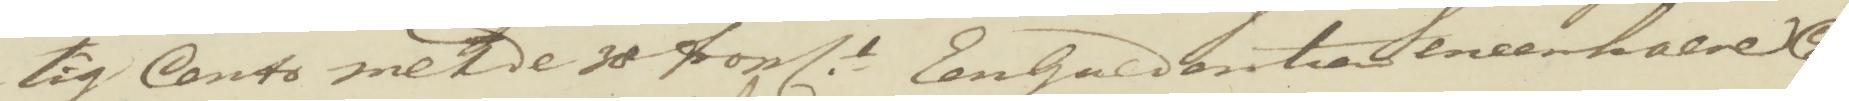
tig Cents met de 10%opC.t Een Gulden tien en een halve Cents
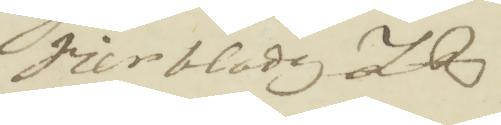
Vier bladen
